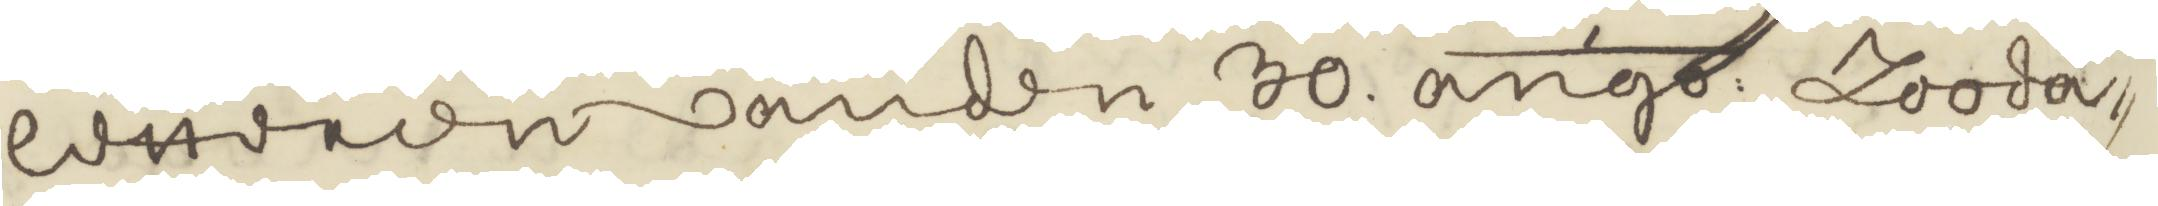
letteren van den 30. augo: zooda„
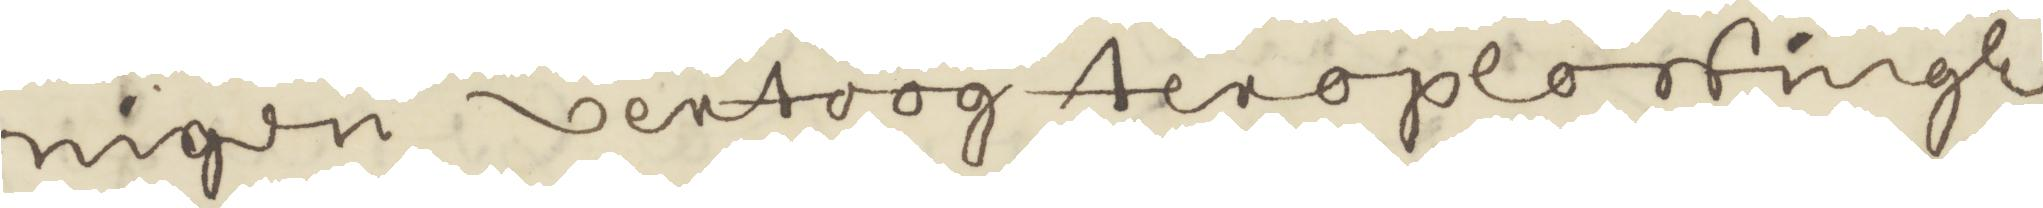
nigen vertoog ter oplossingh
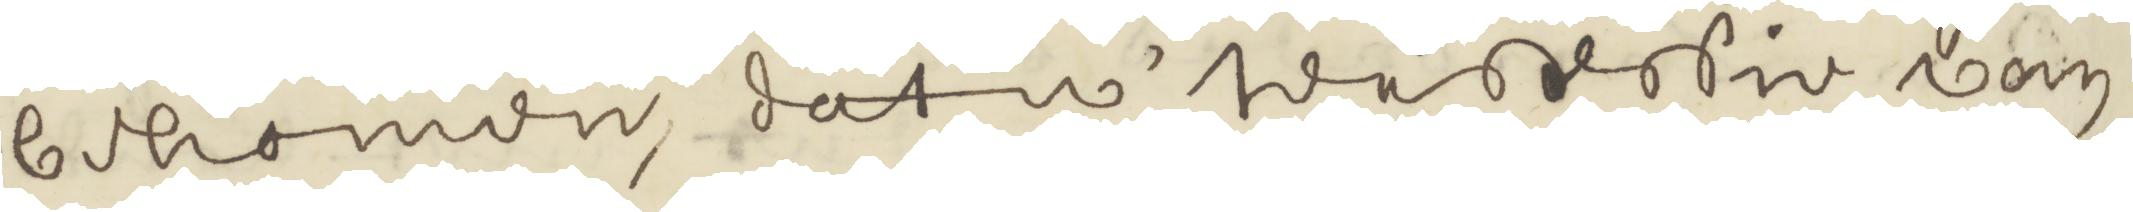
bekomen, dat w' ter sessie van
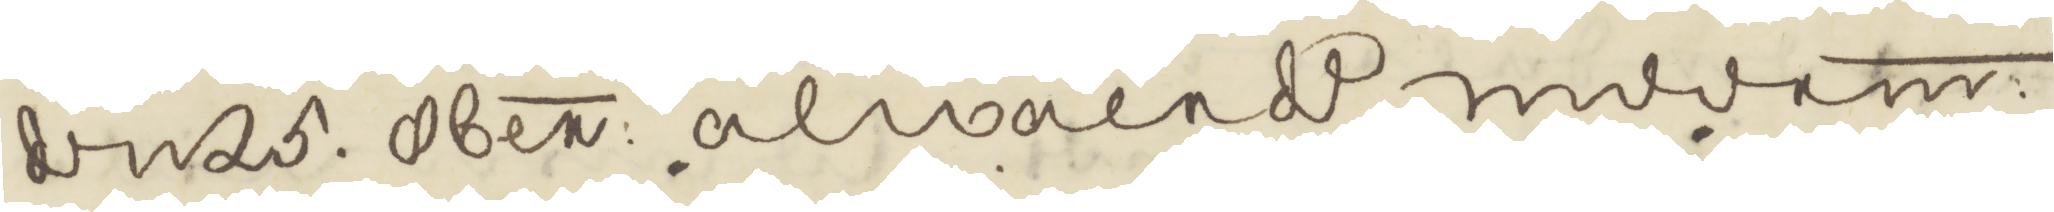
den 25. 8ber: alwaer de meerm:
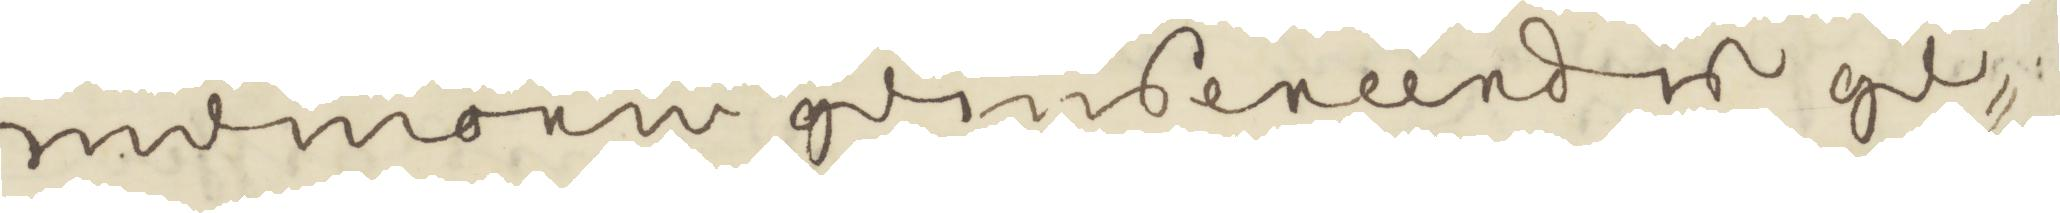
memorie geinsereerd is ge„
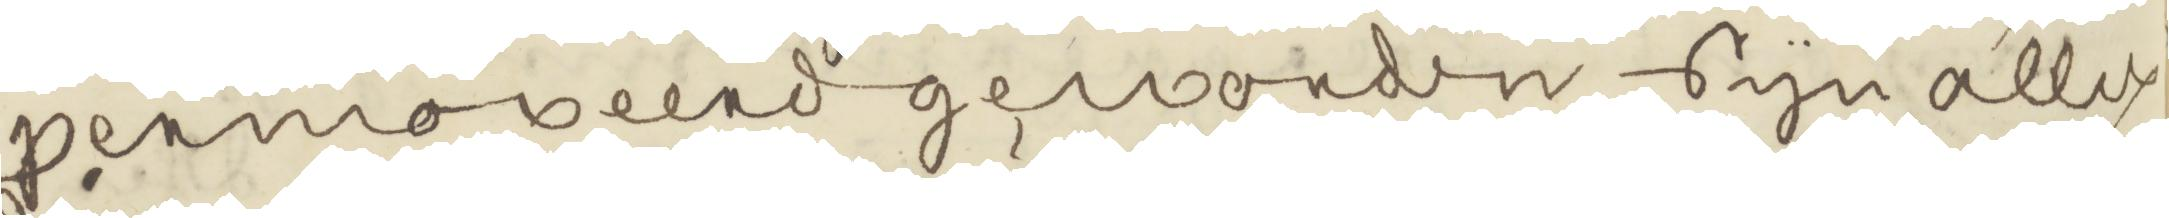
permoveerd geworden sijn alle
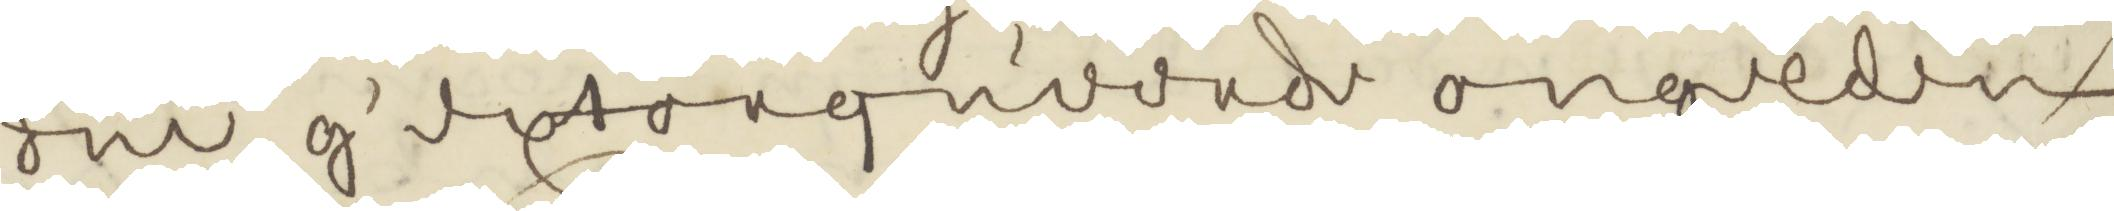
die g’extorqueerde ongelden
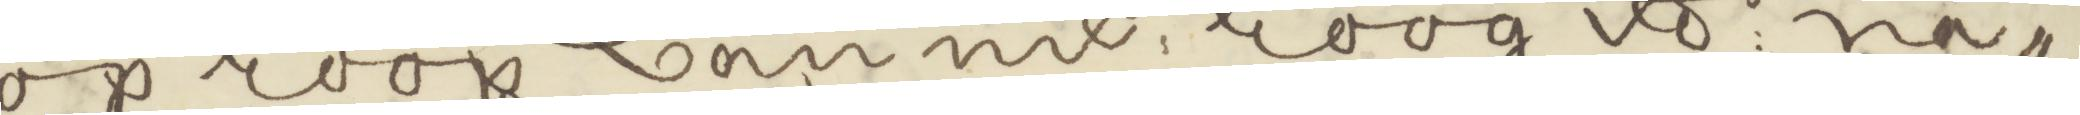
op hoop van uE: hoog Ed:s na„
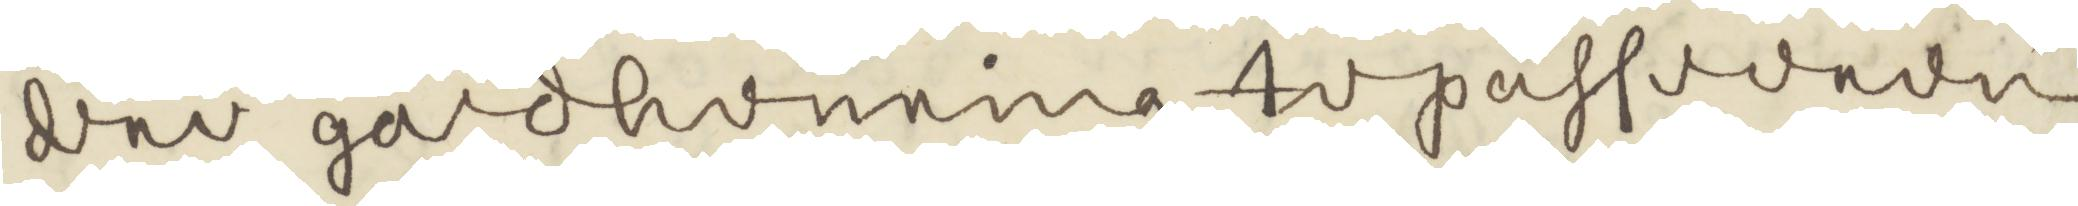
dere goedkeuring te passeeren
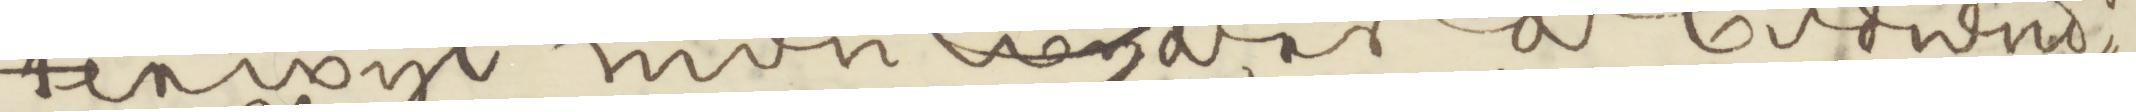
terwijl men wijders de bediend„s
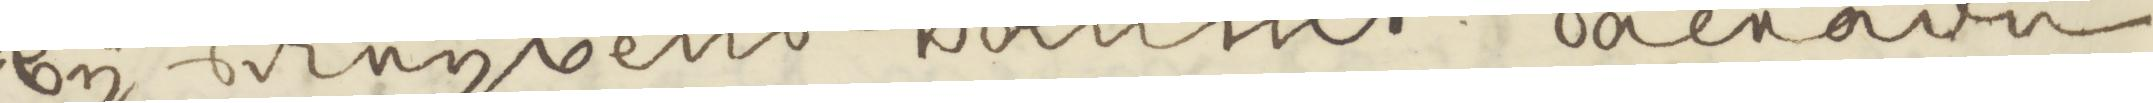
bij schrijvens van ult.o daeraen
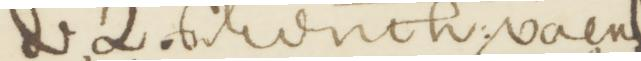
de 2. schenck: vaer
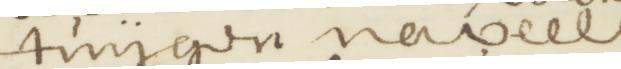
tuijgen na veel
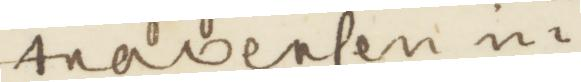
traversen in
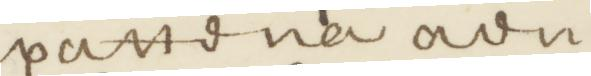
pattena aen
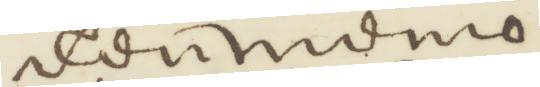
Een memo
